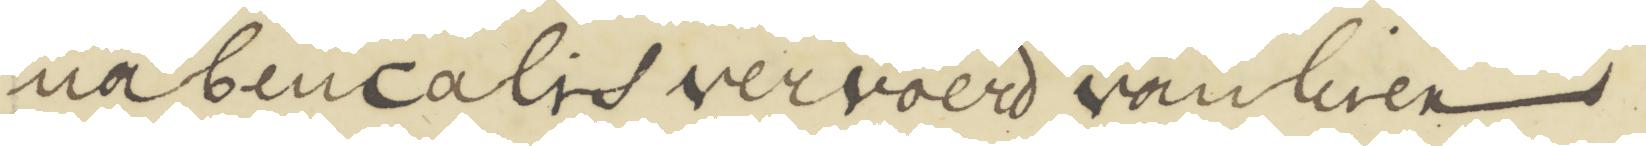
na bencalis vervoerd van hier
